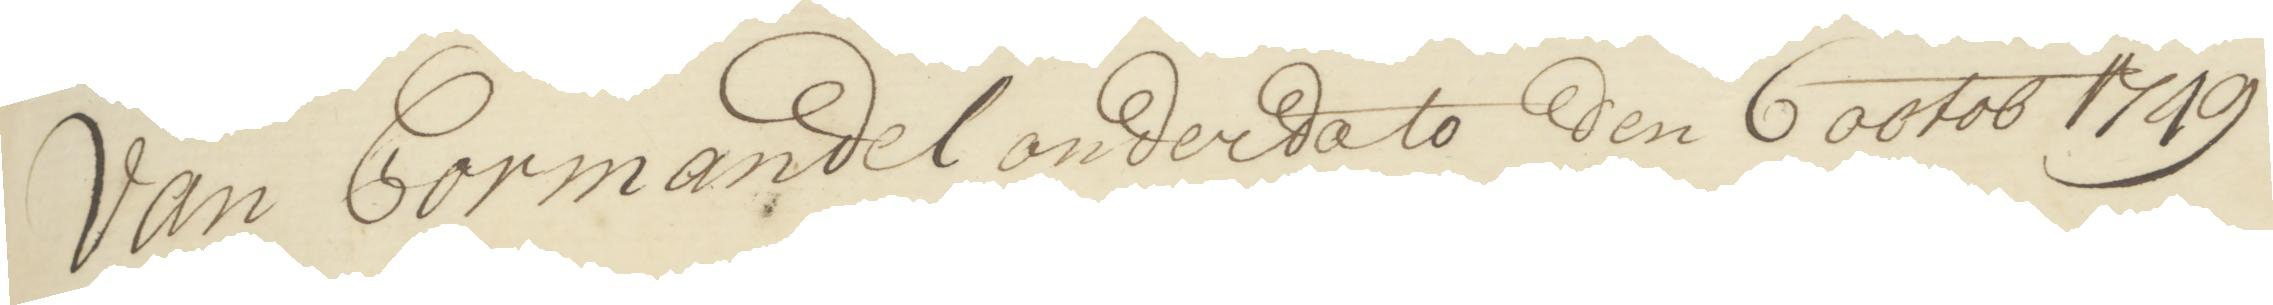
Van Cormandel onderdato den 6 octob 1749
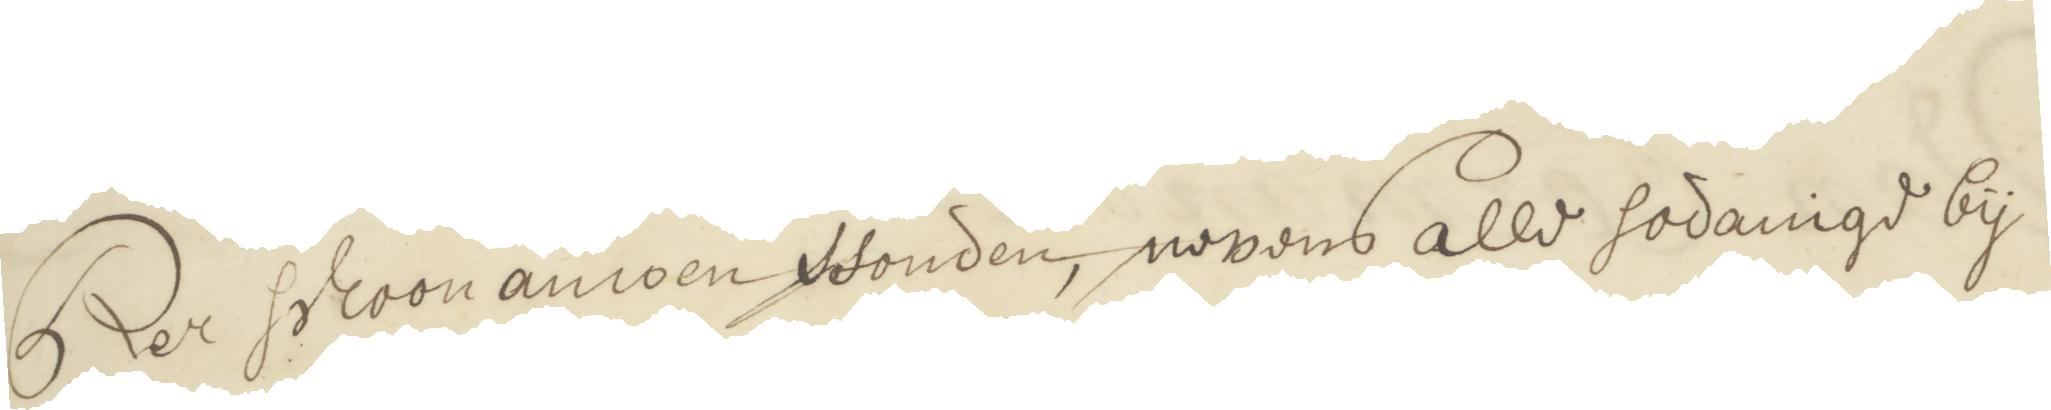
Per schoonauwen versonden, nevens alle sodanige bij
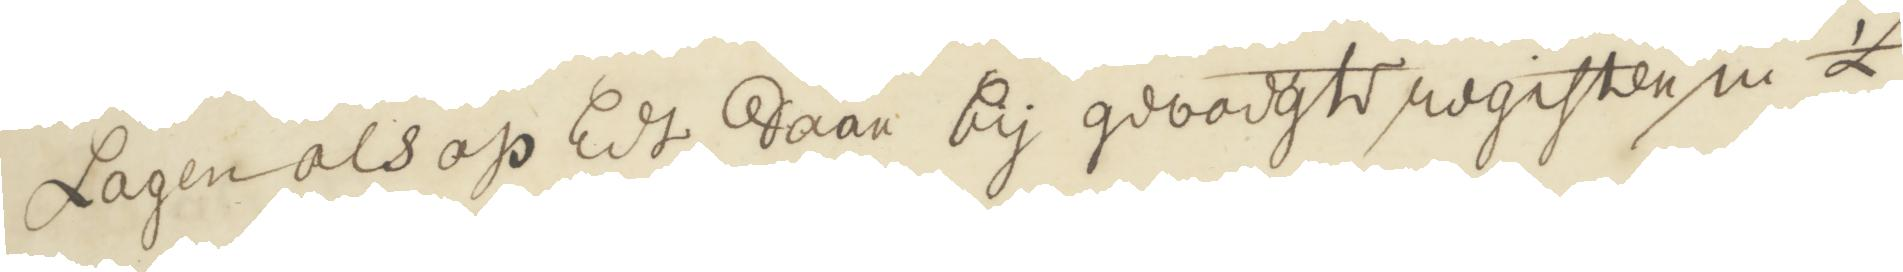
lagen als op het daar bij gevoegte register in ’t
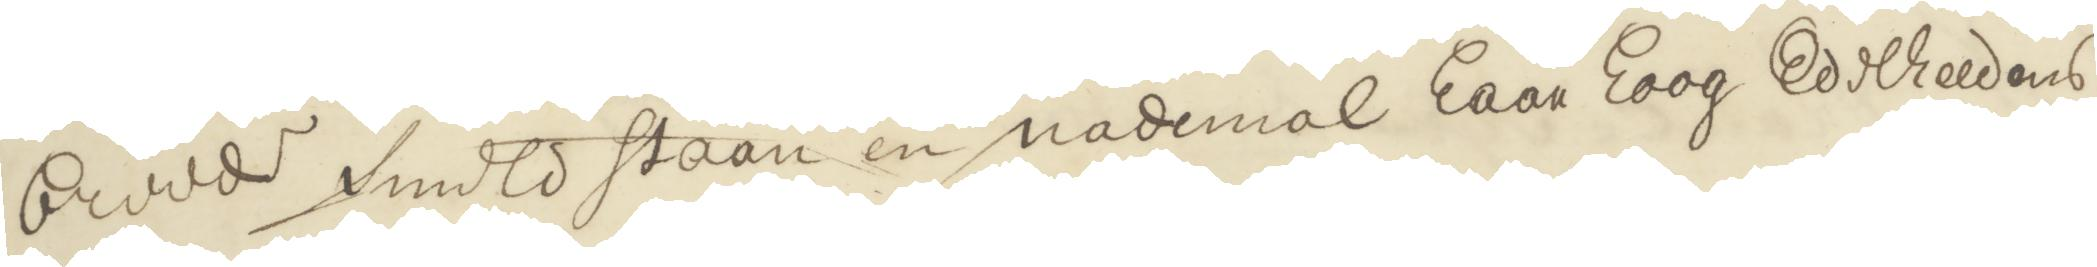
breede vermeld staan en nademal haar hoog Edelheedens
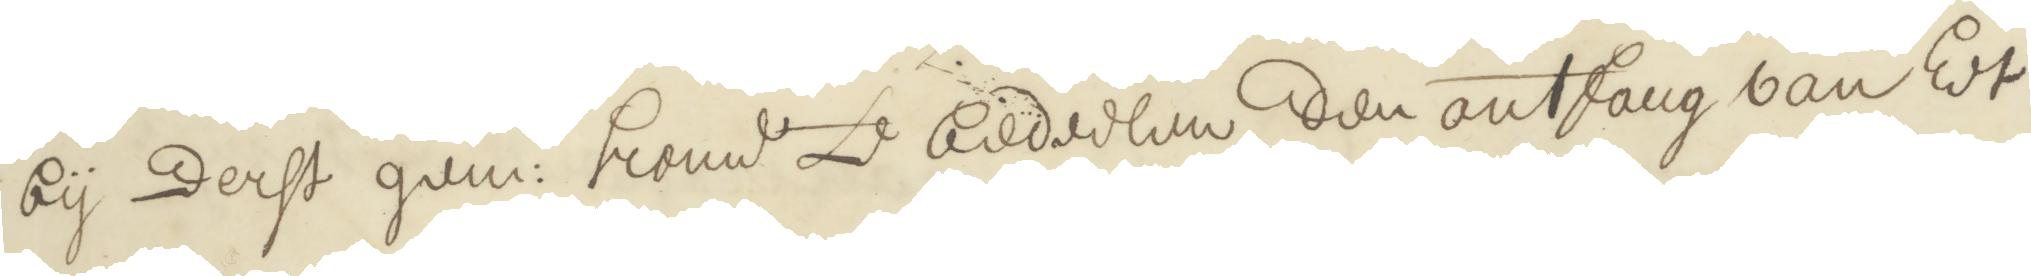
bij Eerst gem: kome te bedeelen den ontfang van het
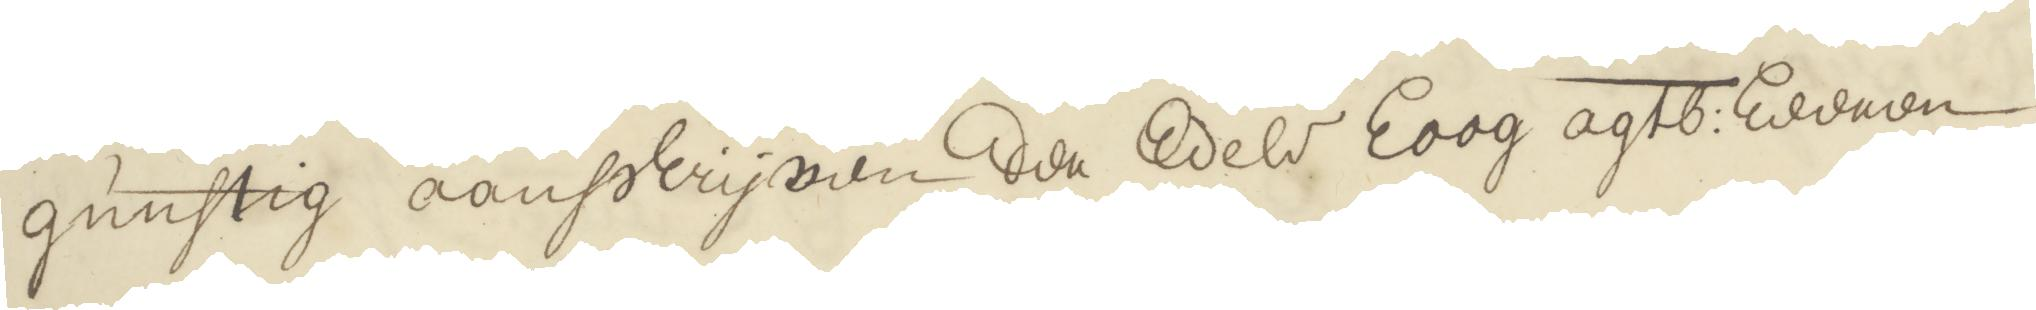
gunstig aanschrijven der Edele hoog agtb: heeren
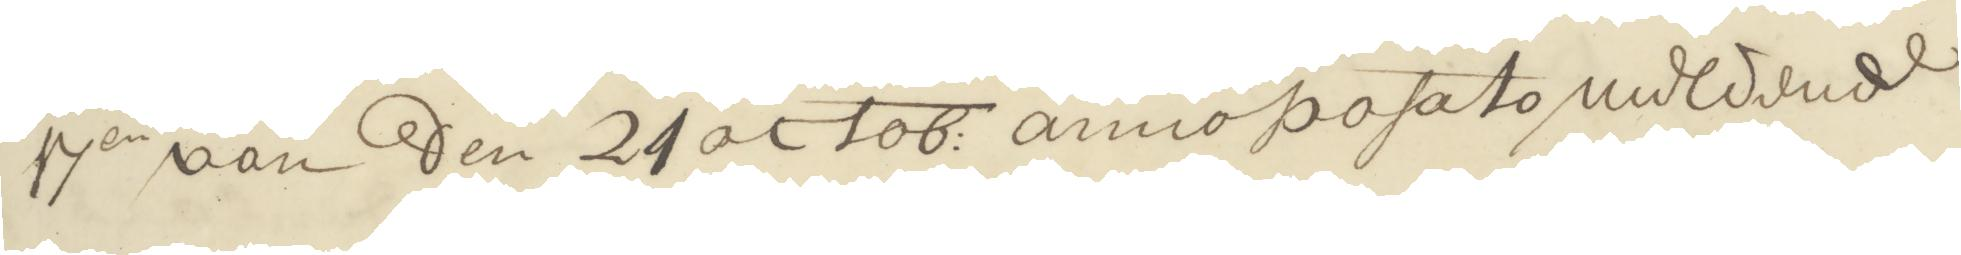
17en van den 24 octob: anno pasato meldende
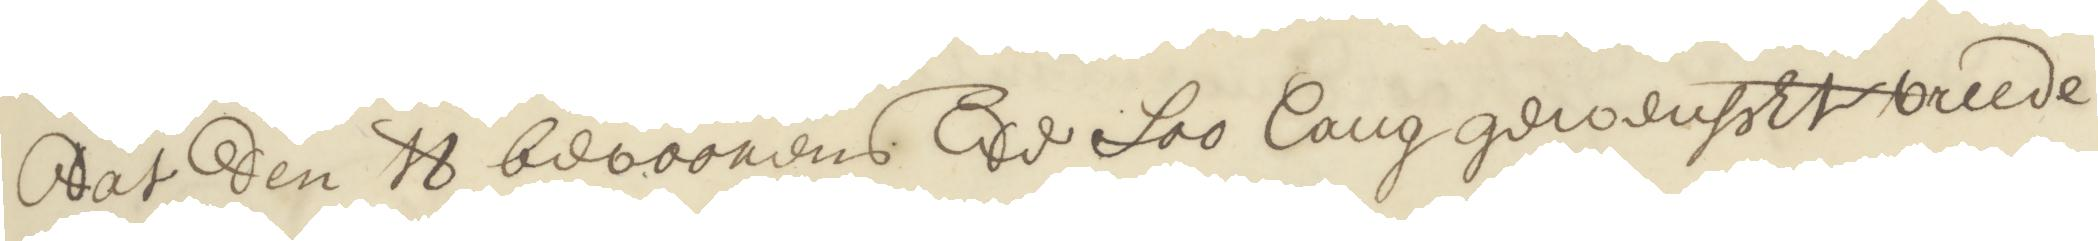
dat den 18 bevoorens de soo lang gewenscht vreede
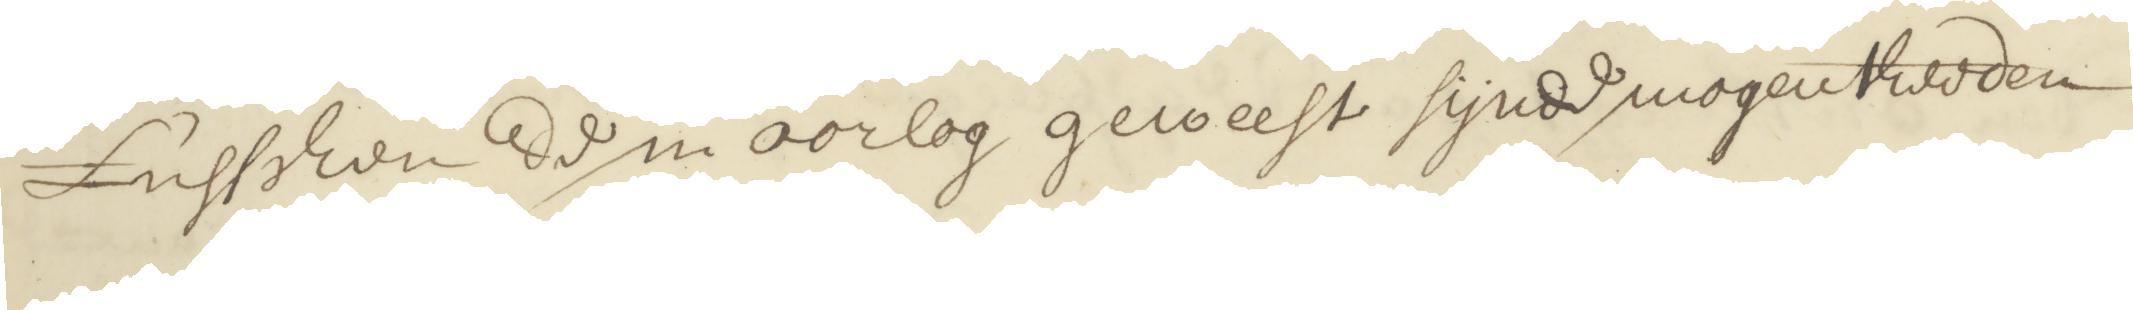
tusschen de in oorlog geweest sijnde mogentheeden
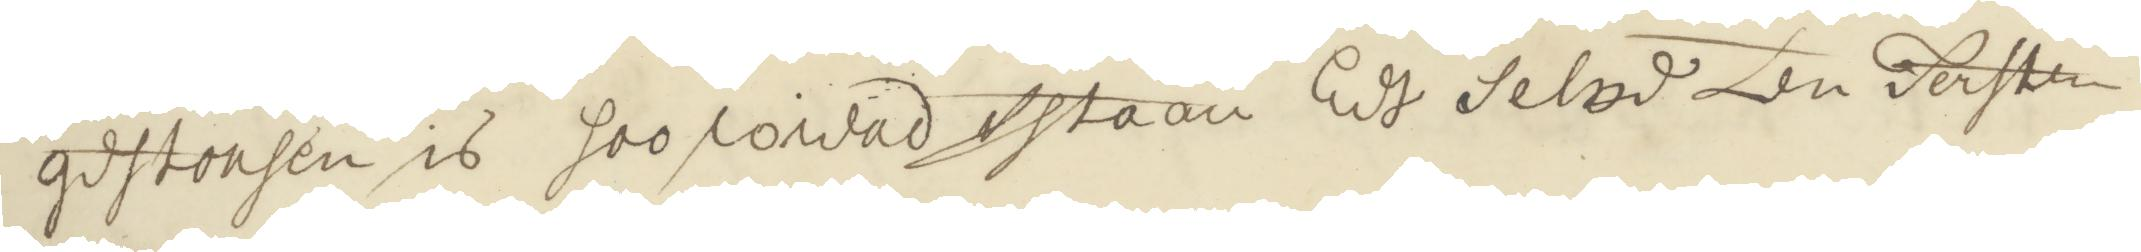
gestorfen is soo wierd verstaan het selve ten Eersten
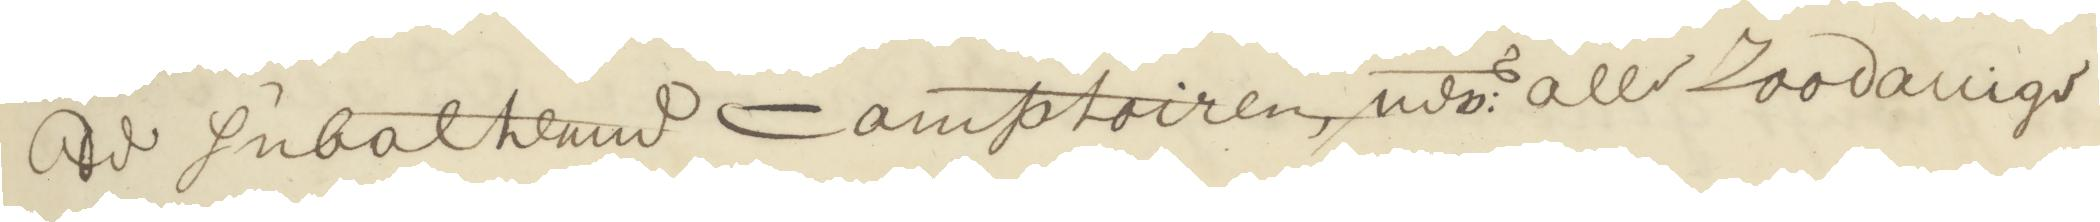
de subalterne comptoiren, nev:s alle zoodanige
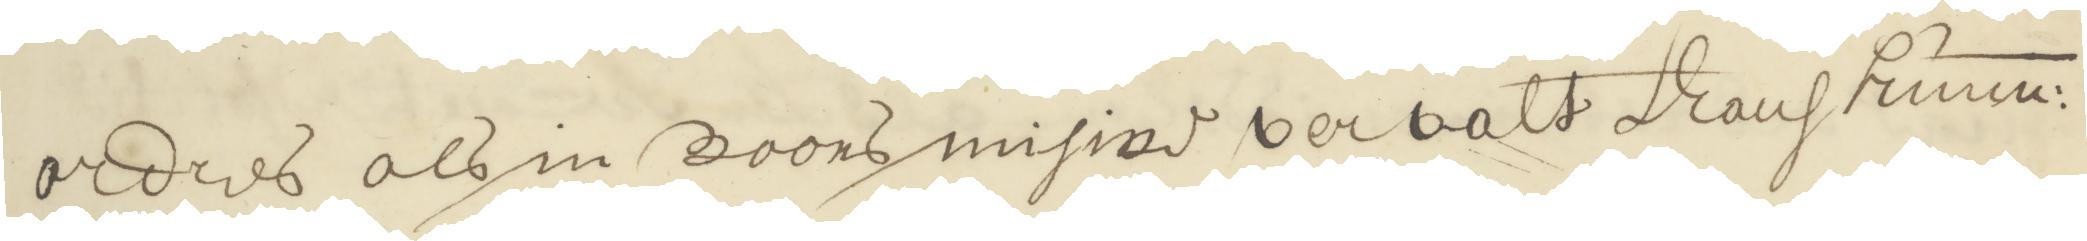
ordres als in voors misive vervalt thans kunn:
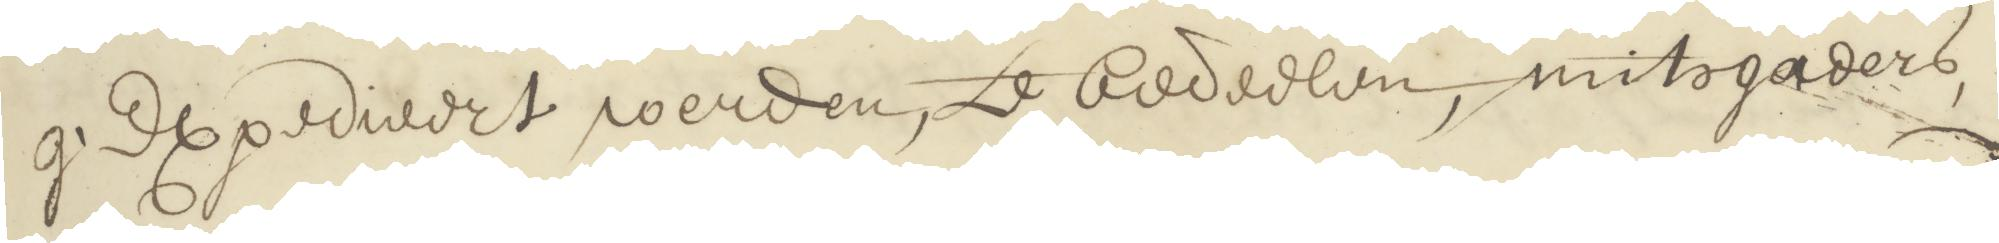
g’ Expedieert werden, te bedeelen, mitsgaders,
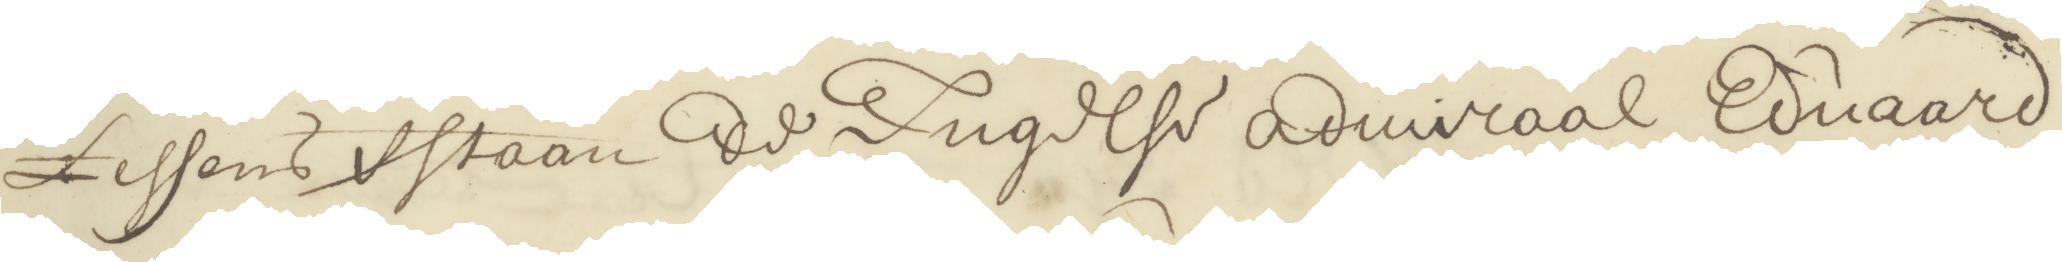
teffens verstaan de Engelse admiraal Eduaard
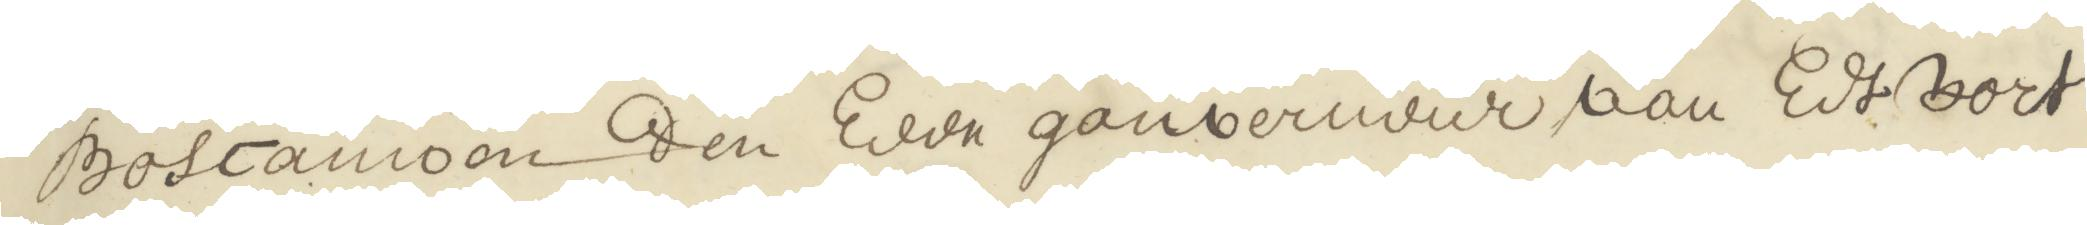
Boscauwen den heer gouverneur van het vort
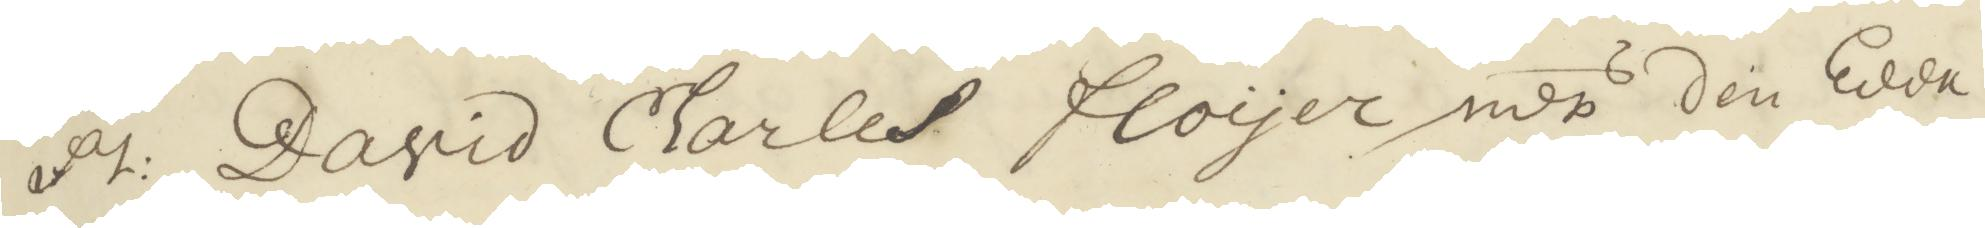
st: David Charles floijer nevs den heer
